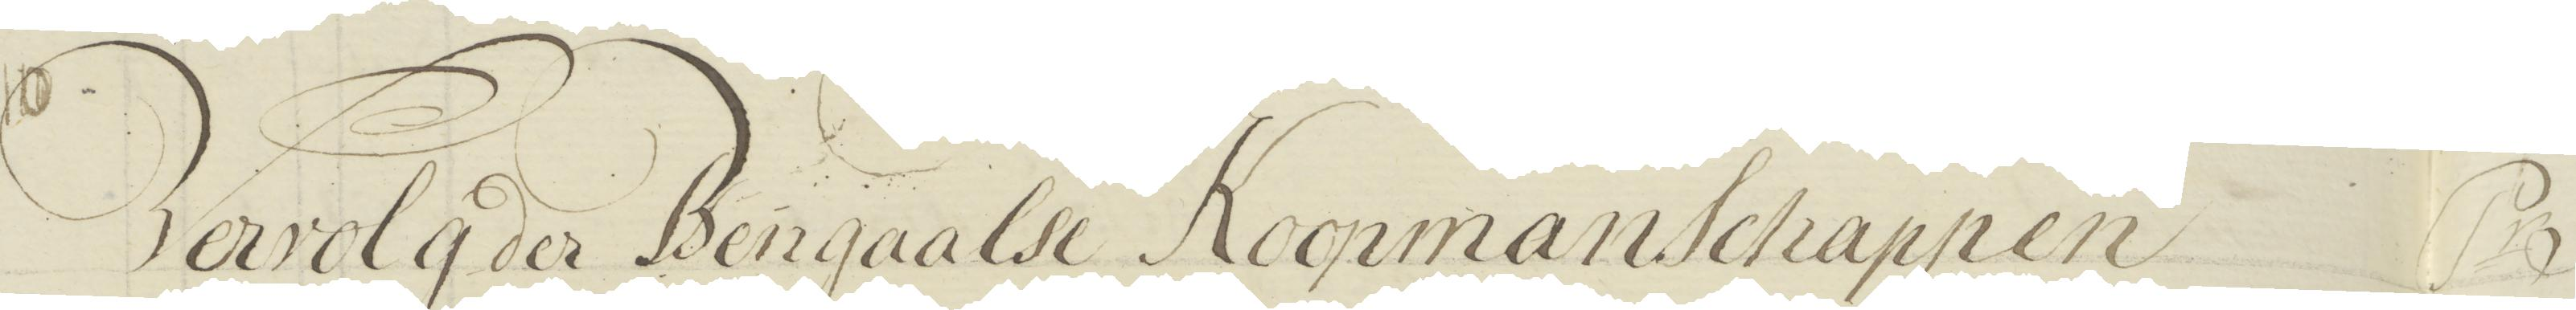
Vervolg de Bengaalse Koopmanschappen
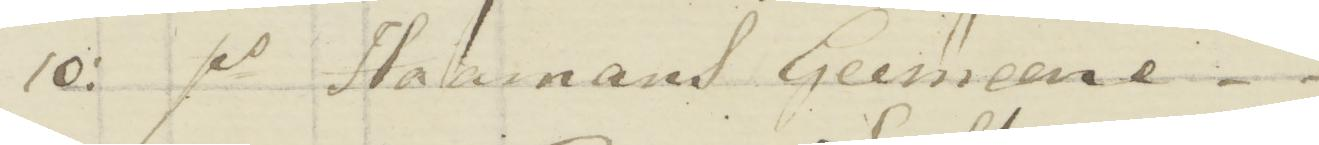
10: p=s Haamans Geemeene —
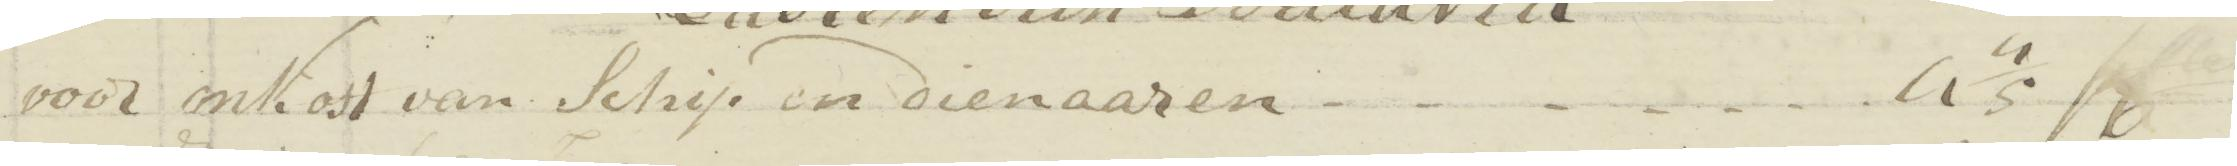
voor onkost van Schip en dienaaren - - - - - - 4 4/5 pC=tes
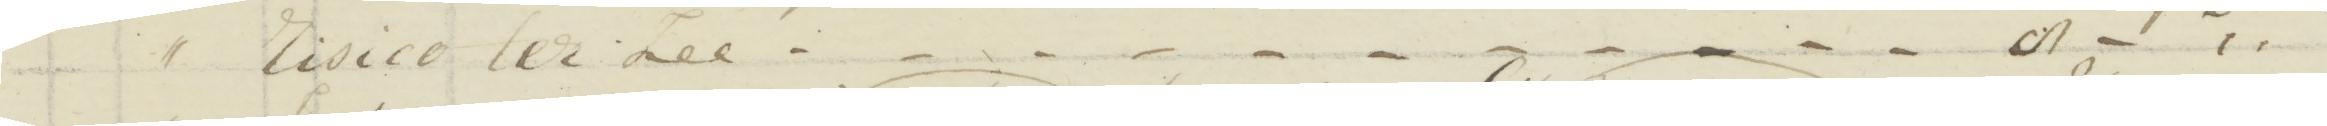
„ Risico ter Zee - - - - - - - - - - - 8 — „
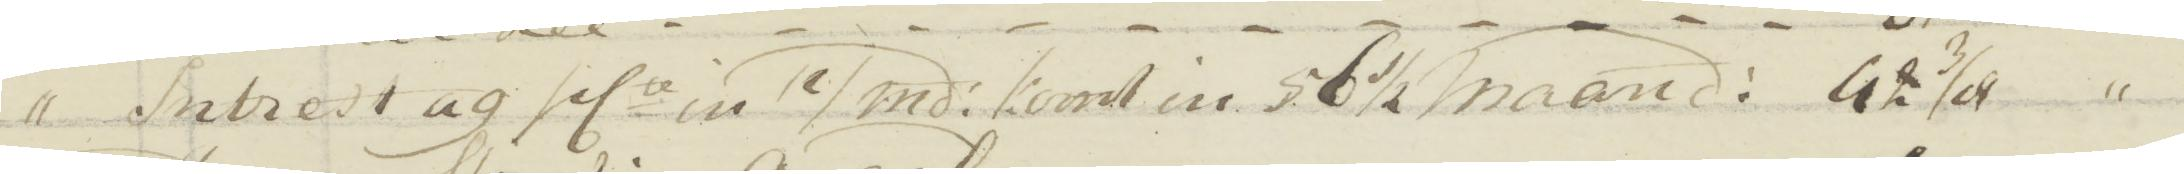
„ Intrest a9 pC=te in 12/ md: komt in 56½ maand: 42 3/8 „
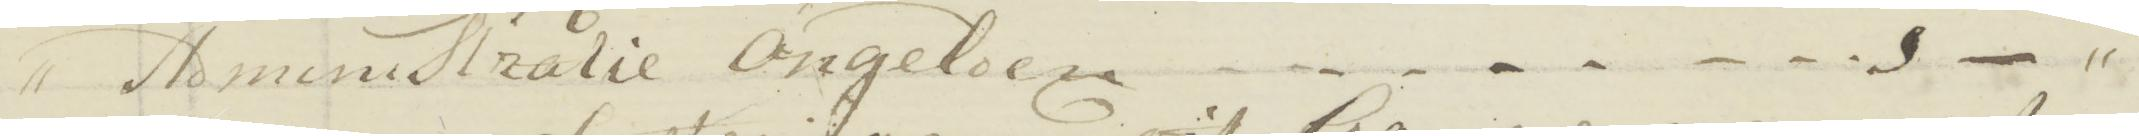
„ Administratie Ongelden - - - - - - - - - 1 — „
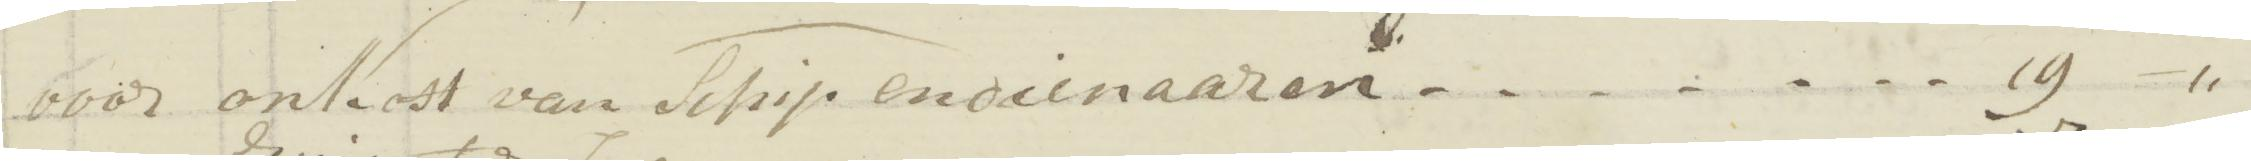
voor onkost van schip endienaaren - - - - - - - 19 —„
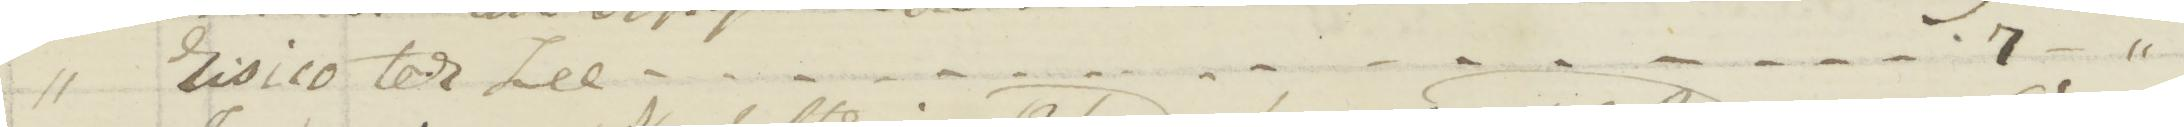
„ Risico ter Zee - - - - - - - - - - - - - - - 7 — „
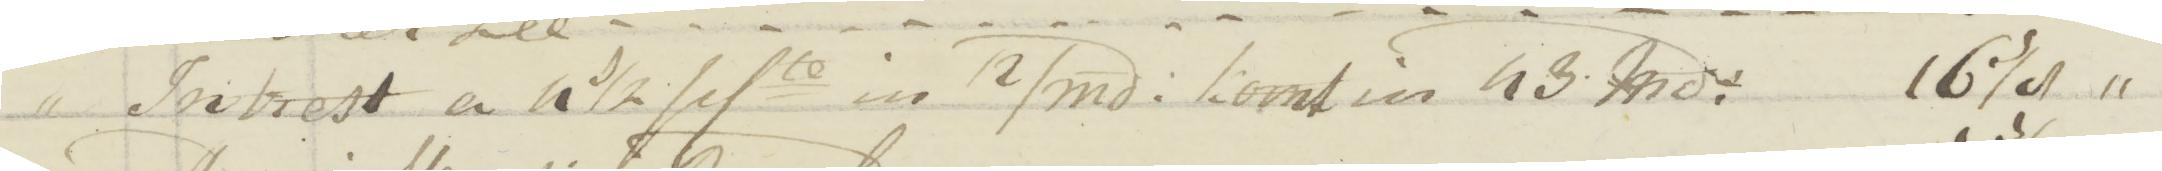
„ Intrest a 4½ pC=te in 12/md: komt in 43 md„s 16 1/8 „
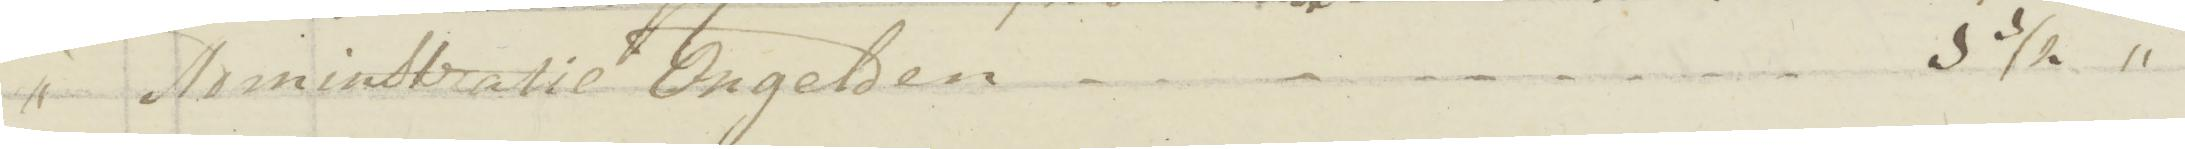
„ Adminstratie Ongelden - - - - - - - - - 1 ½ „
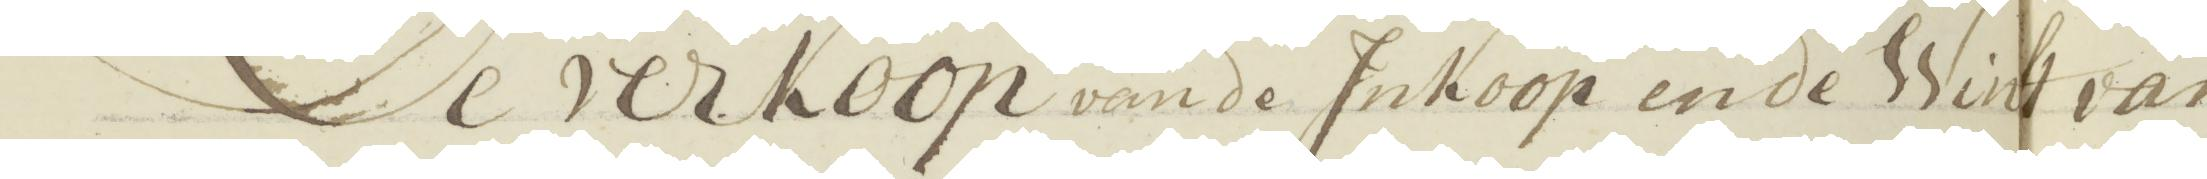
De verkoop van de Jnkoop en de Winst va
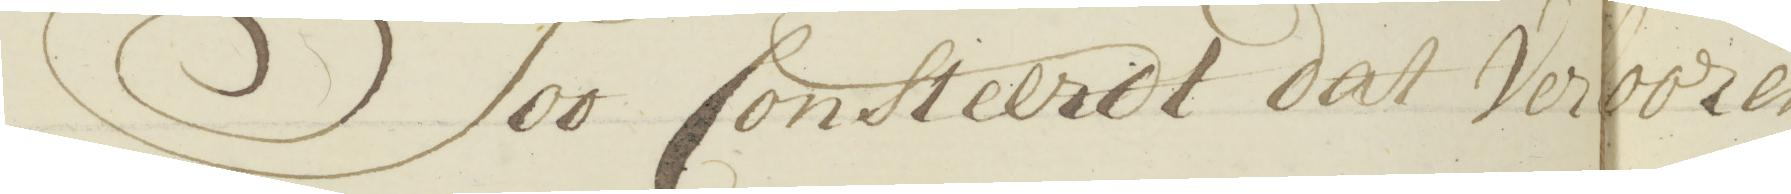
Soo Consteerdt dat Verloore
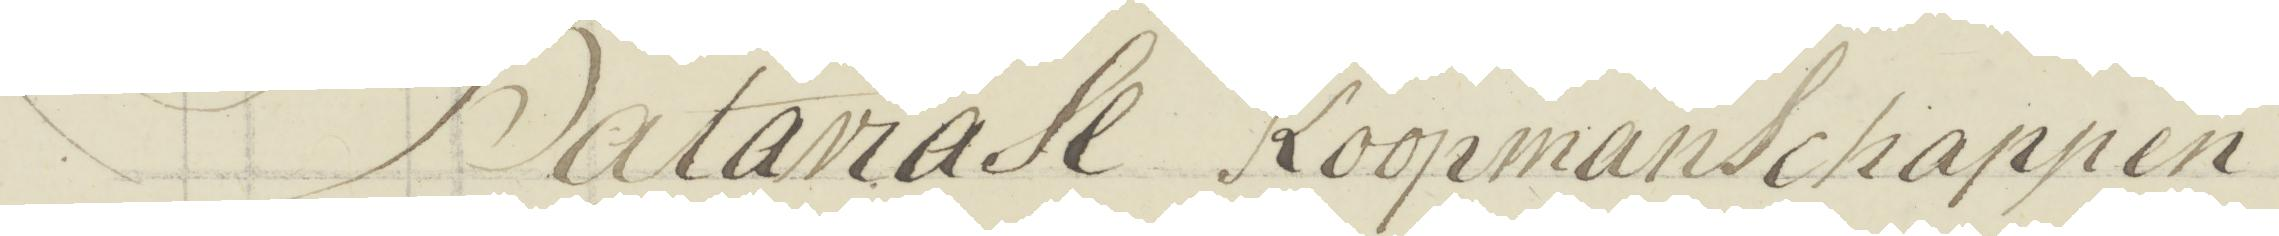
Bataviase Koopmanschappen
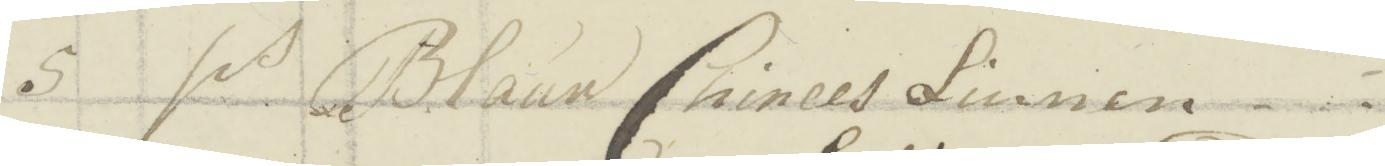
5 ps Blauw Chinees Linnen - -
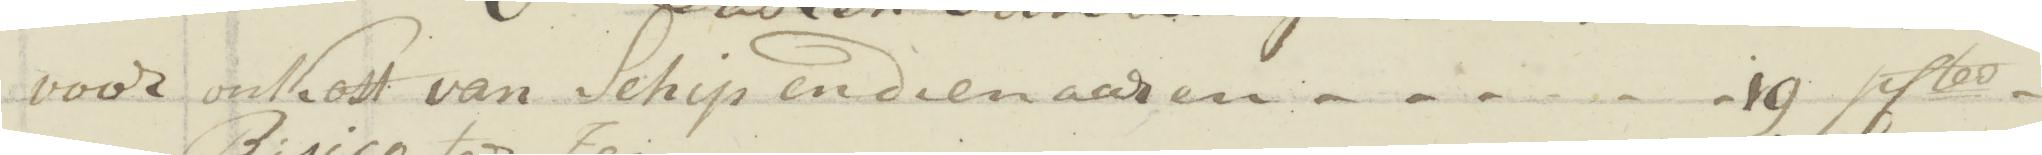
voor onkost van schip en dienaaren - - - - - 19 pCtes -
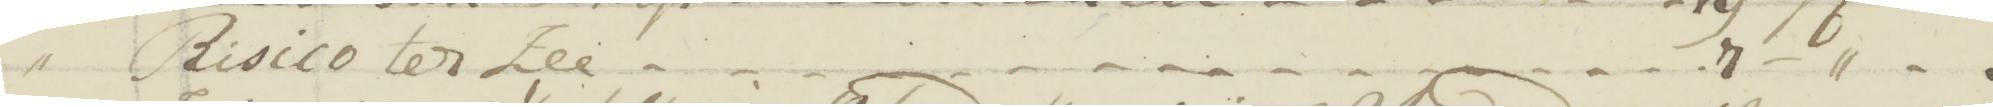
„ Risico ter Zee - - - - - - - - - - - - - - 7 — „ -
